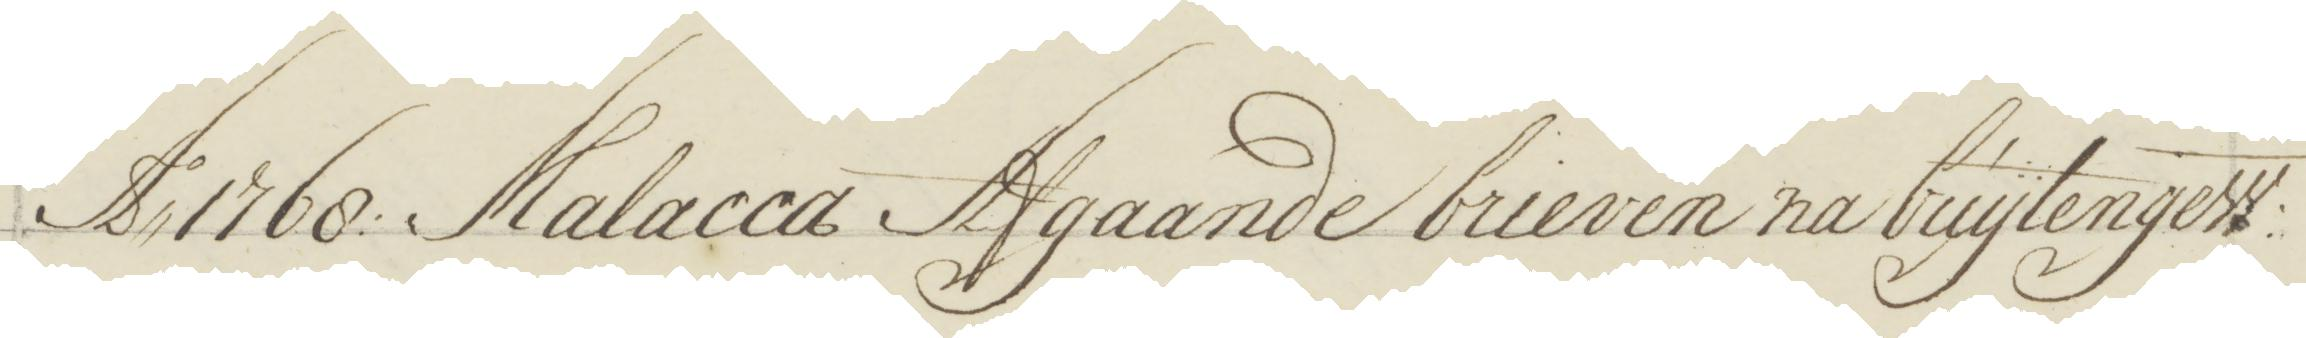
A„o 1768. Malacca Afgaande brieven na buijtengew:
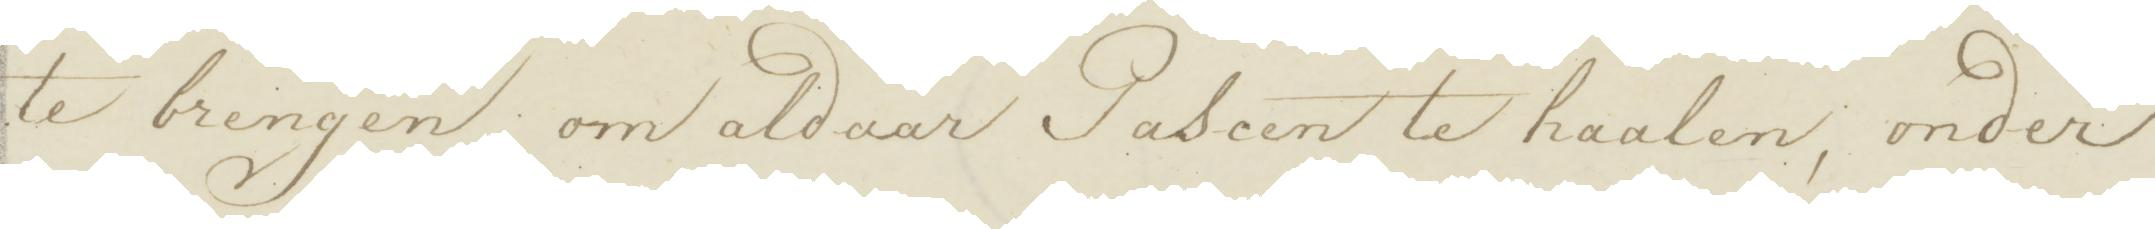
te brengen, om aldaar Pascen te haalen, onder
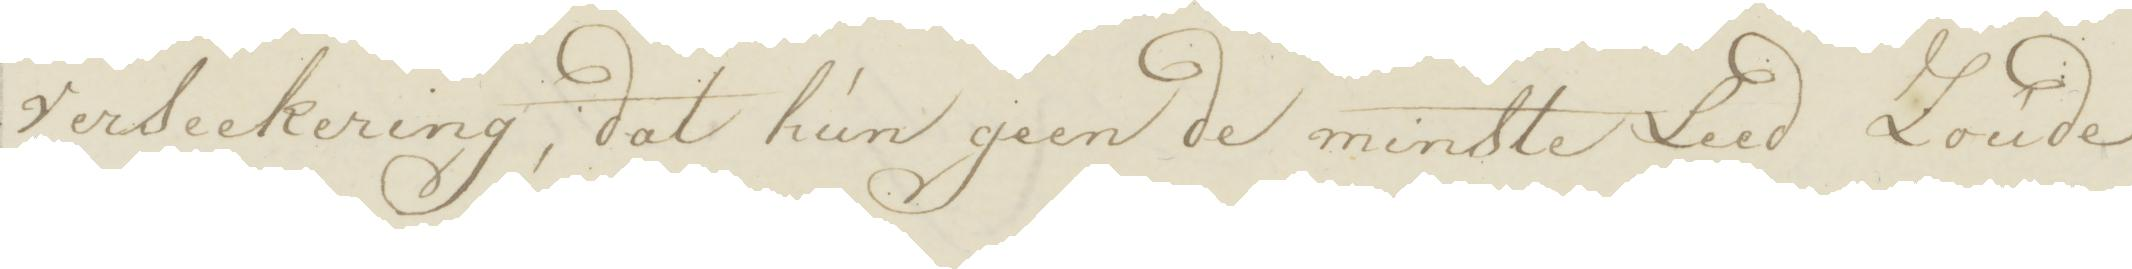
verseekering, dat hun geen de minste leed zoude
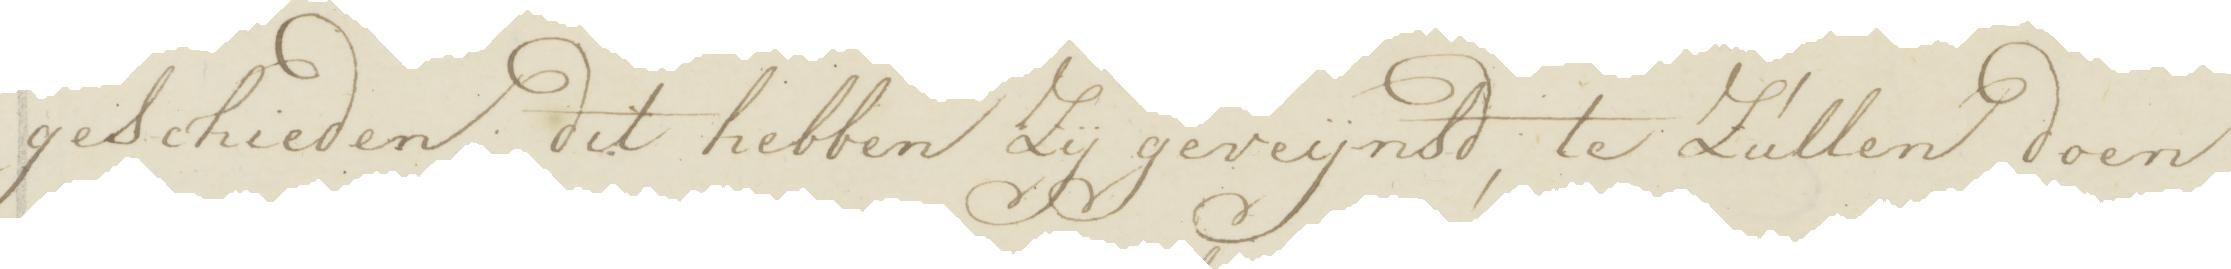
geschieden, dit hebben zij geveijnsd, te zullen doen,
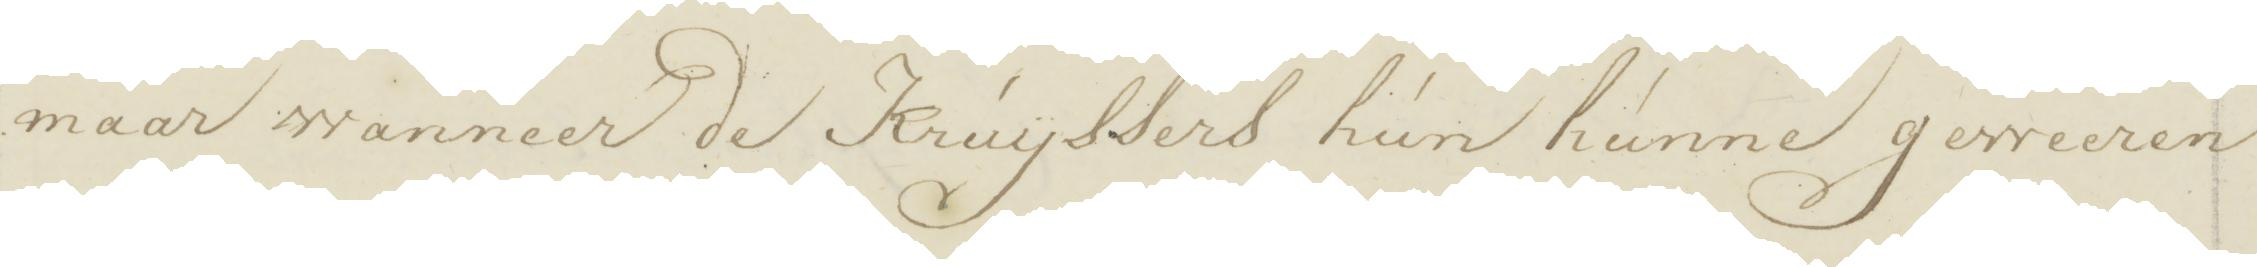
maar wanneer de Kruijssers hun hunne geweeren
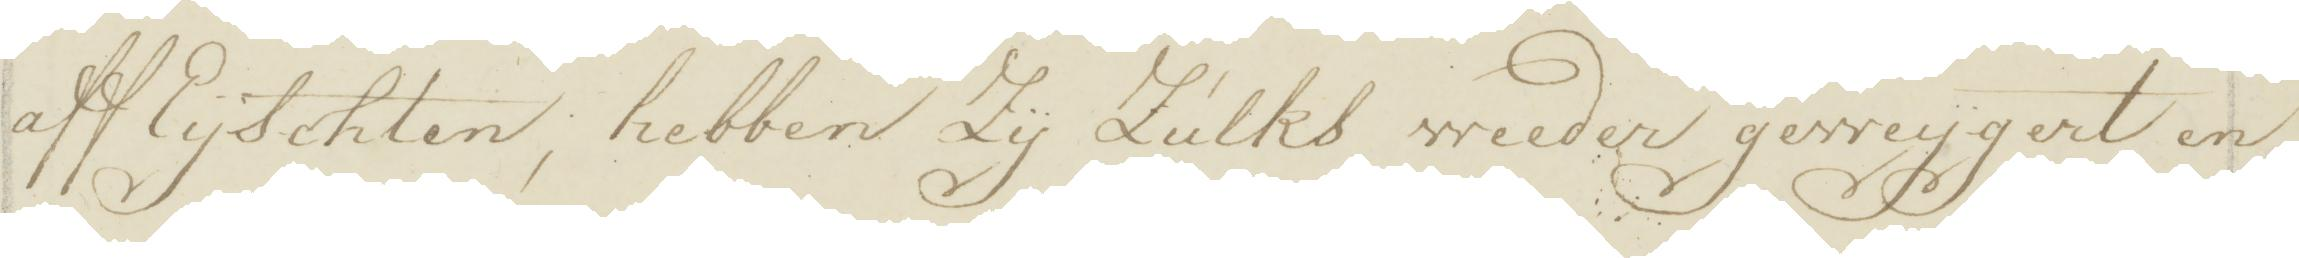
aff Eijschten, hebben zij zulks weeder geweijgert en
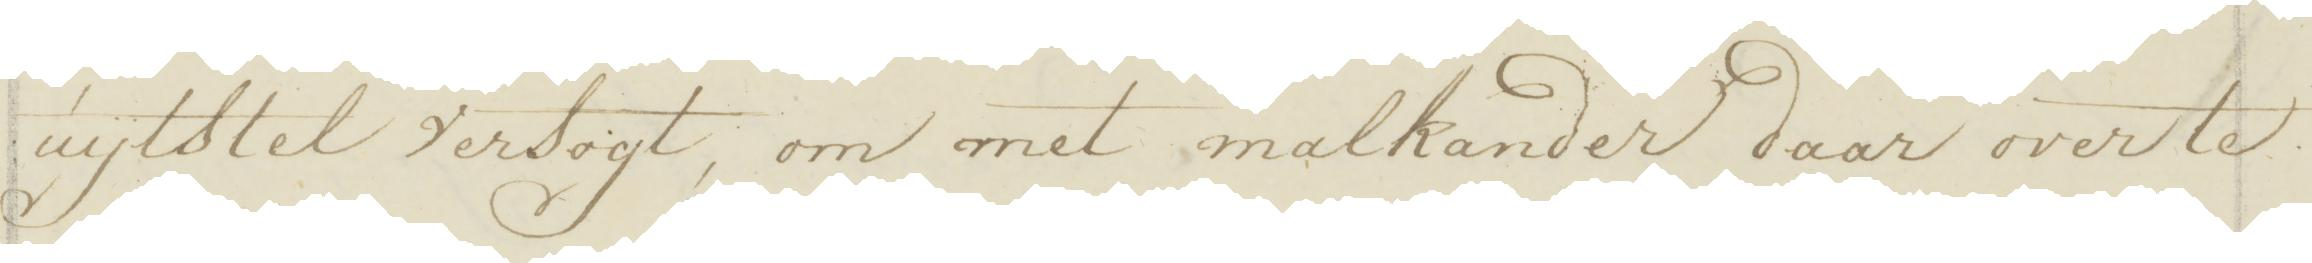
uijtstel versogt, om met malkander daar over te
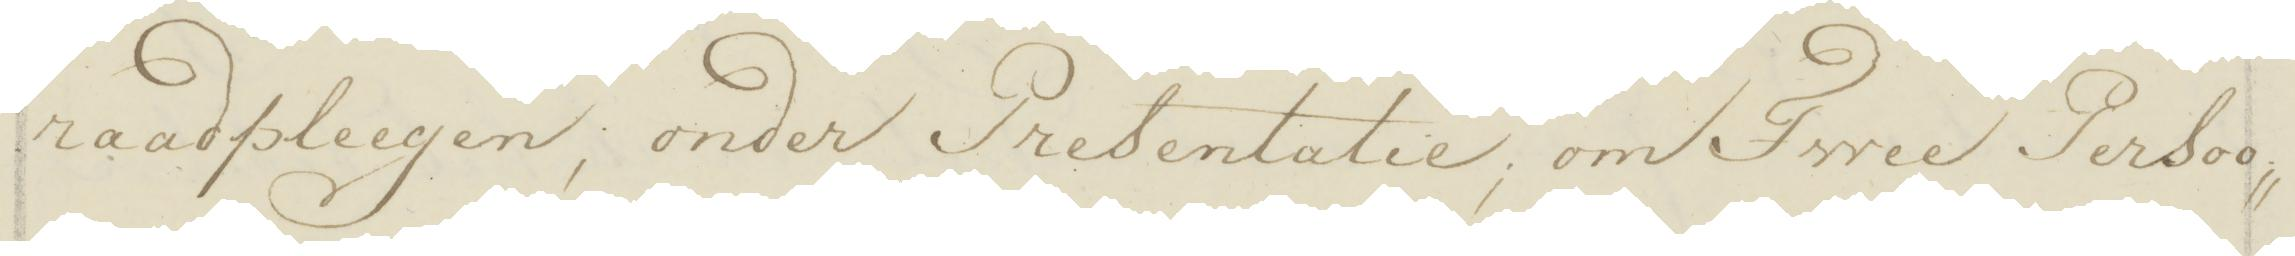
raadpleegen, onder Presentatie, om Twee Persoo„
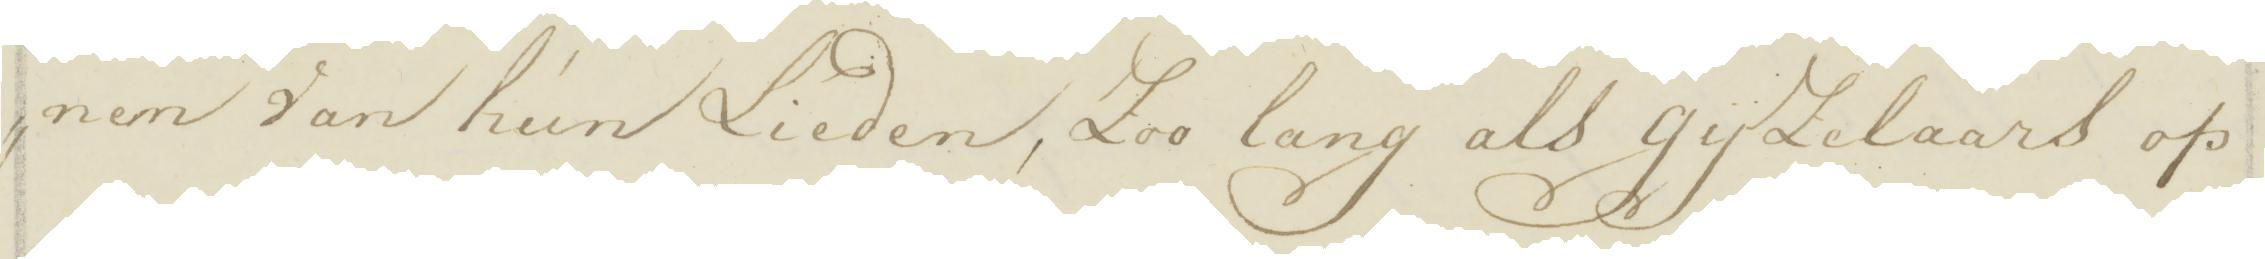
„nen van hun lieden, zoo lang als gijzelaars op
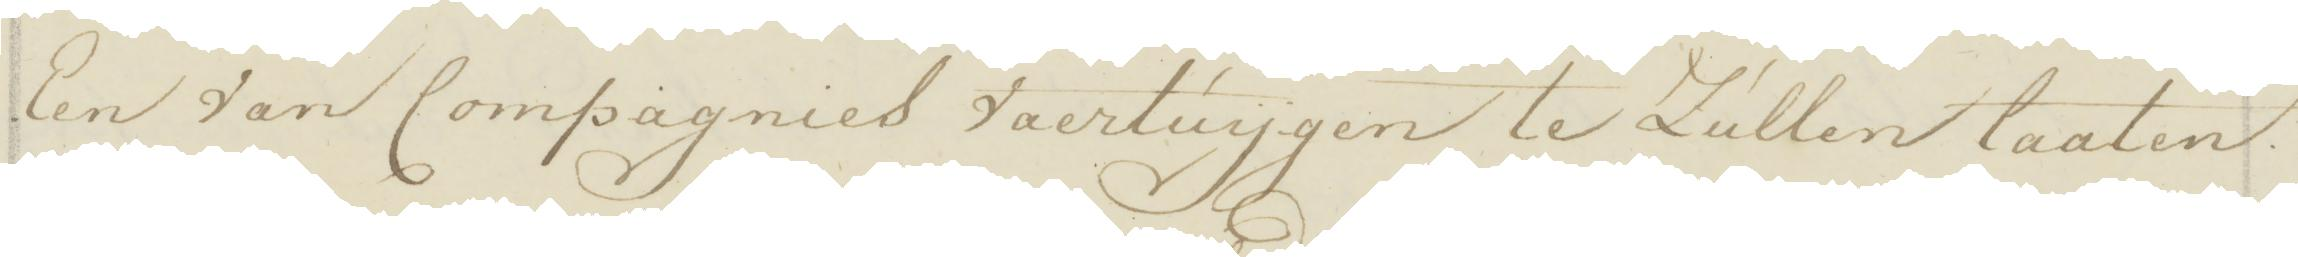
Een van compagnies vaertuijgen te zullen laaten
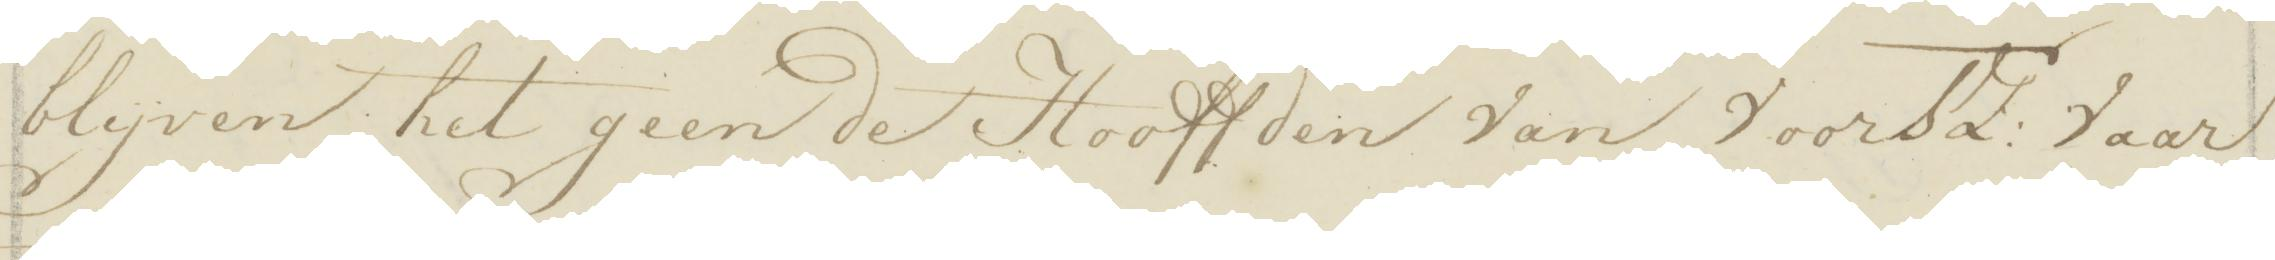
blijven, het geen de Hooffden van voorsz: vaar
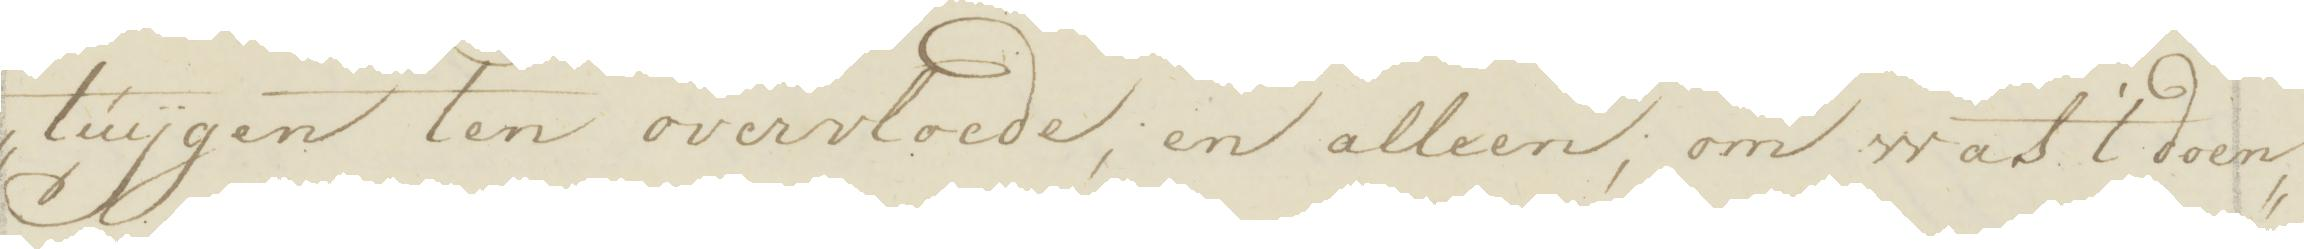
„tuijgen ten overvloede, en alleen, om was 't doen„
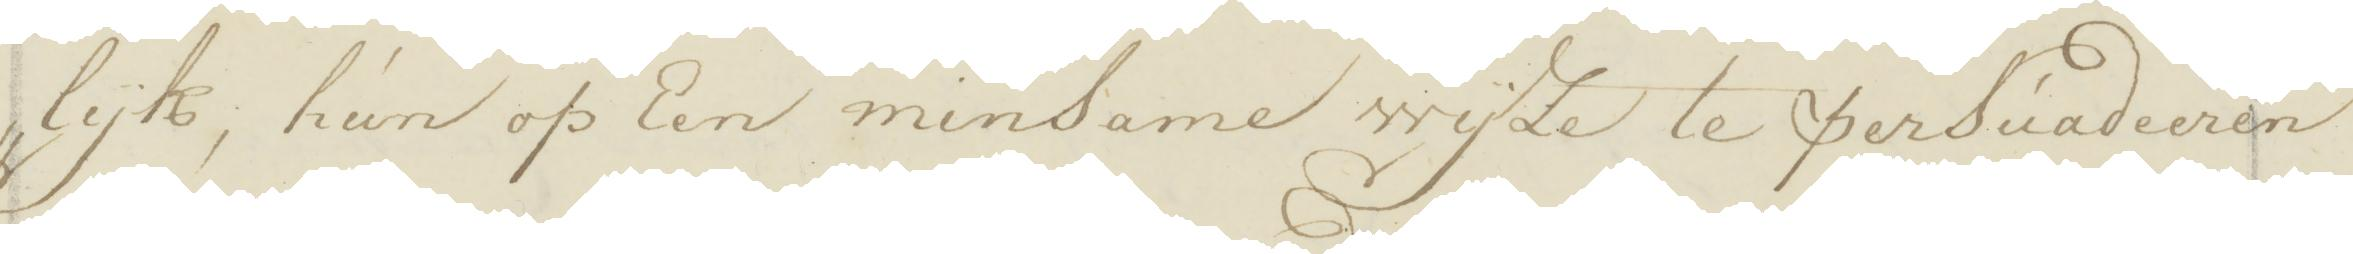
„lijk, hun op Een minsame wijze te persuadeeren
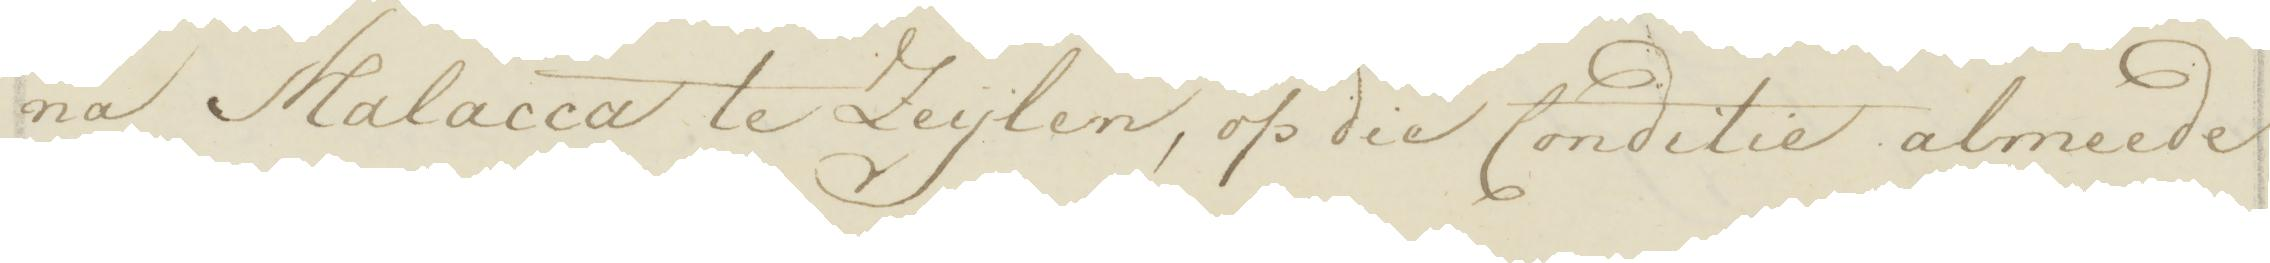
na Malacca te zeijlen, op die conditie almeede
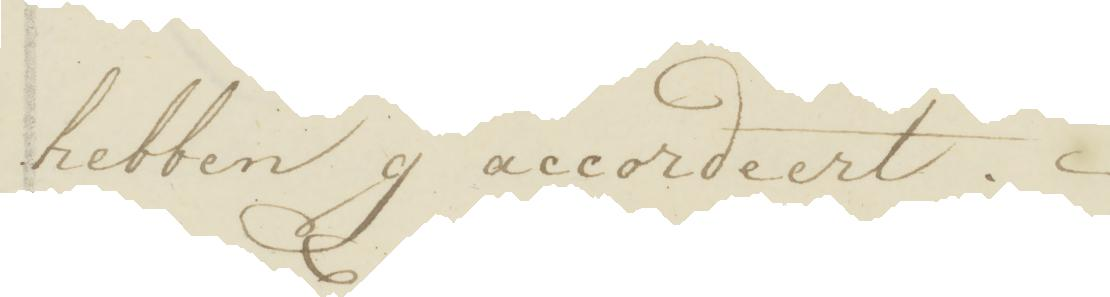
hebben g’accordeert. —
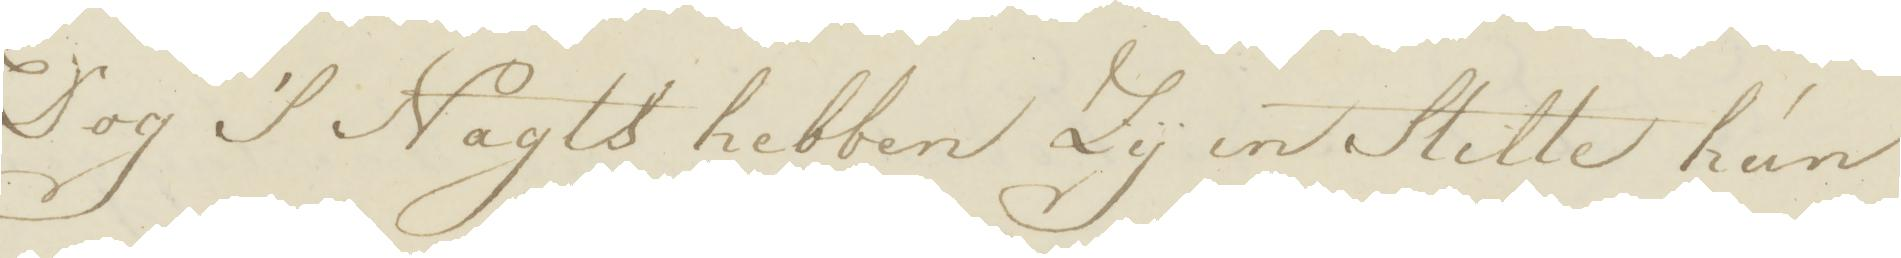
Dog 's Nagts hebben zij in stilte hun
